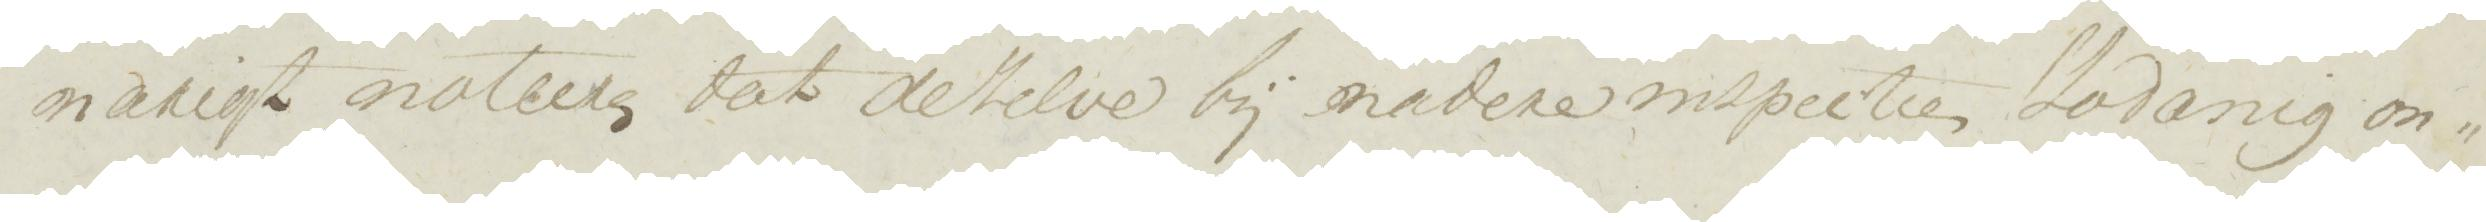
narigt noteeren dat dezelve bij nadere inspectien Zodanig on„
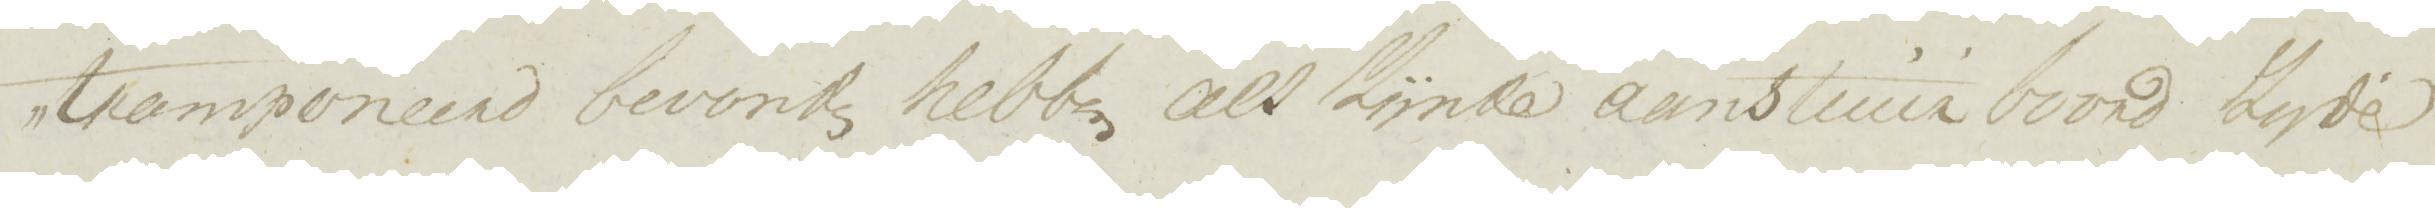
„tramponeerd bevonden hebben als Zijnde aanstuur boord Zyde
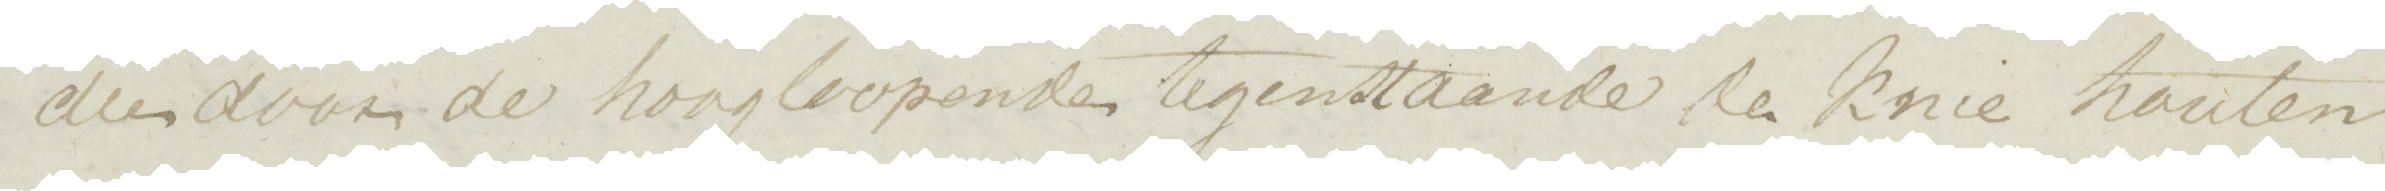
die door de hoogloopende tegenstaande de knie houten
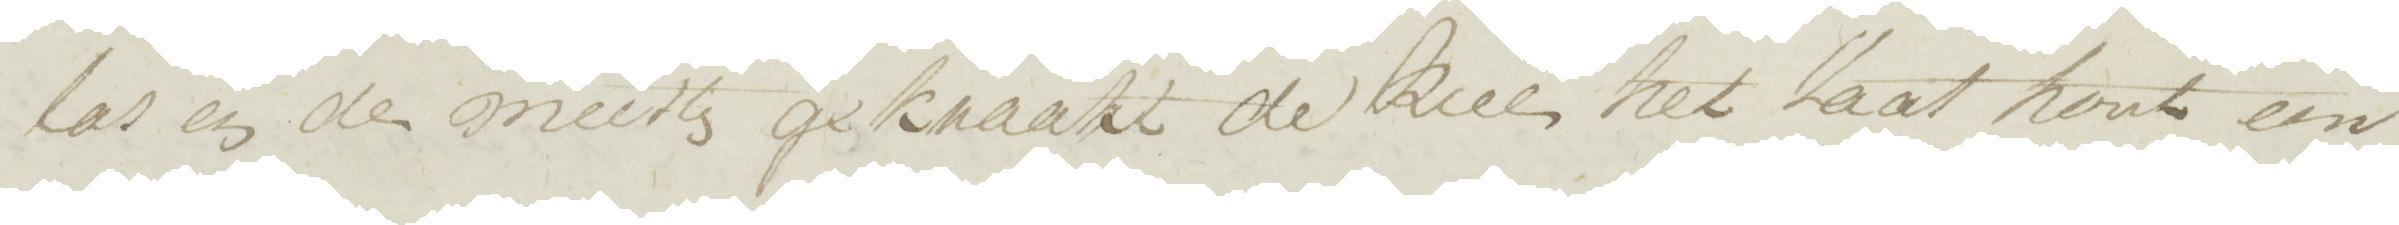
las en de meesten gekraakt de Kiel het Laat hout een
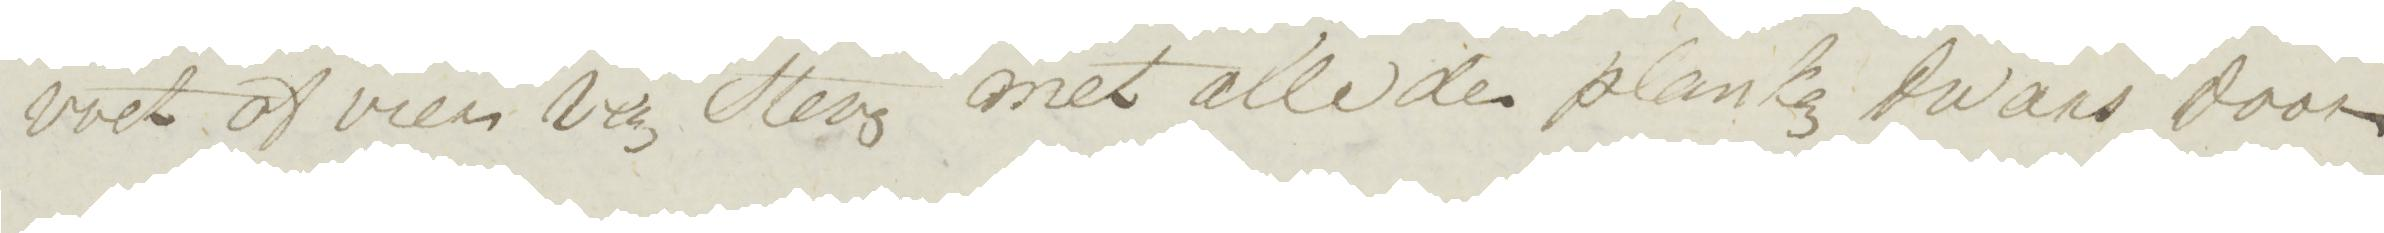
voet of vier van Steven met alle de planken dwars door
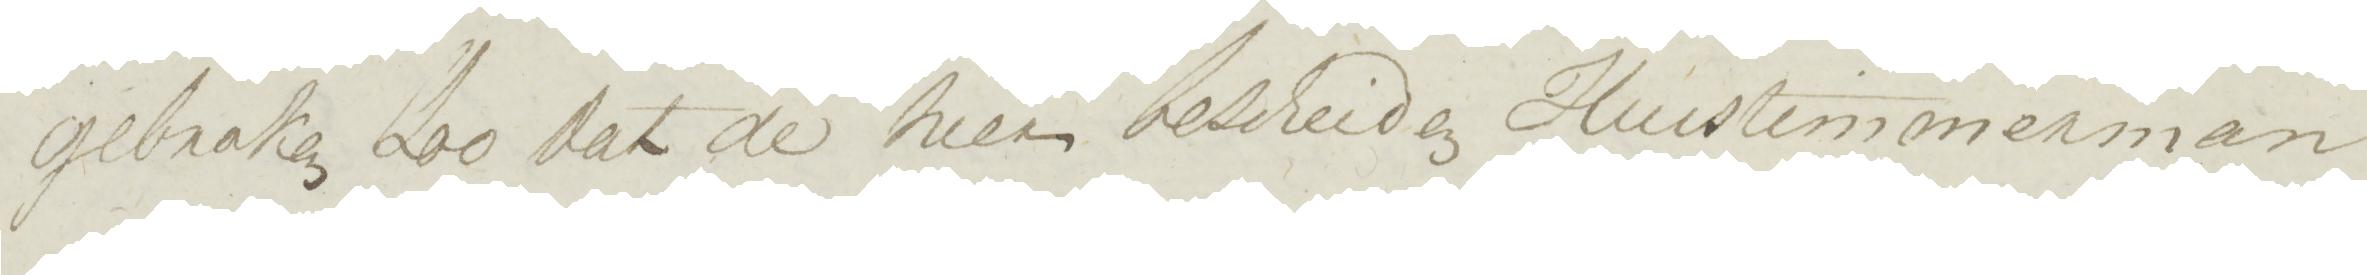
gebroken Zoo dat de hier bescheiden Huistimmerman
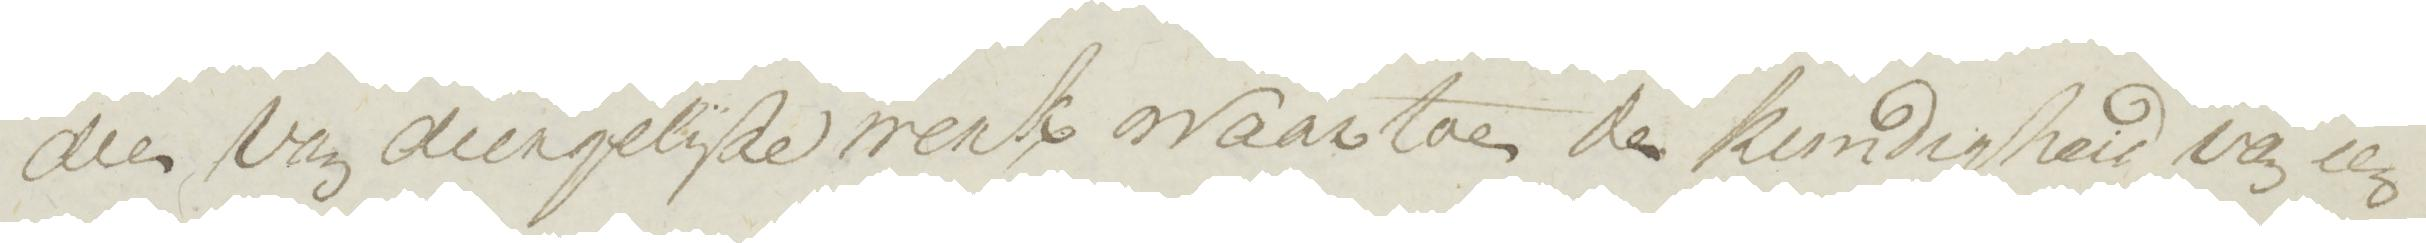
die van diergelijke werk waartoe de kundigheid van een
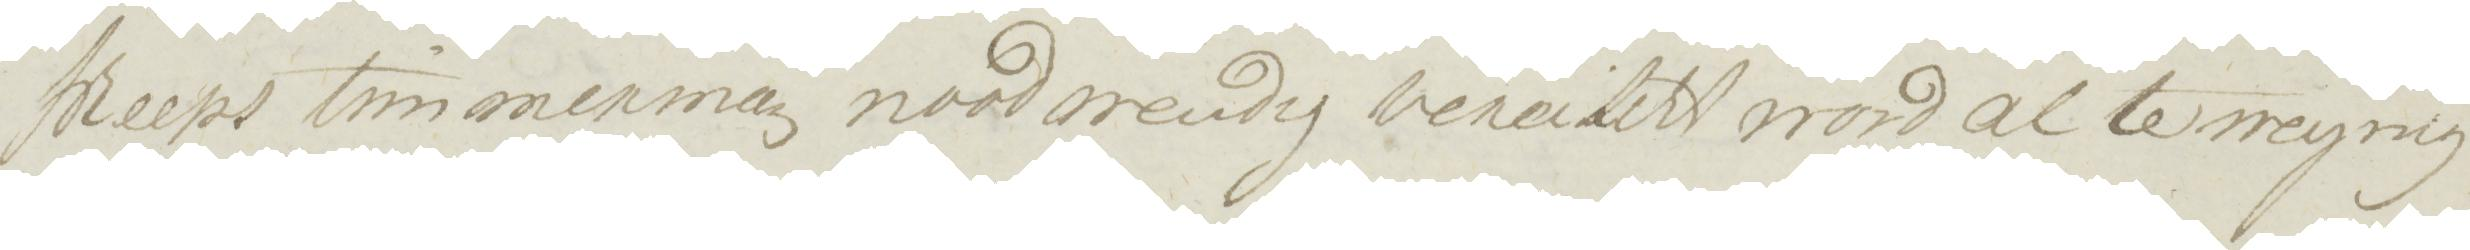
scheeps timmerman noodwendig vereischt word al te weynig
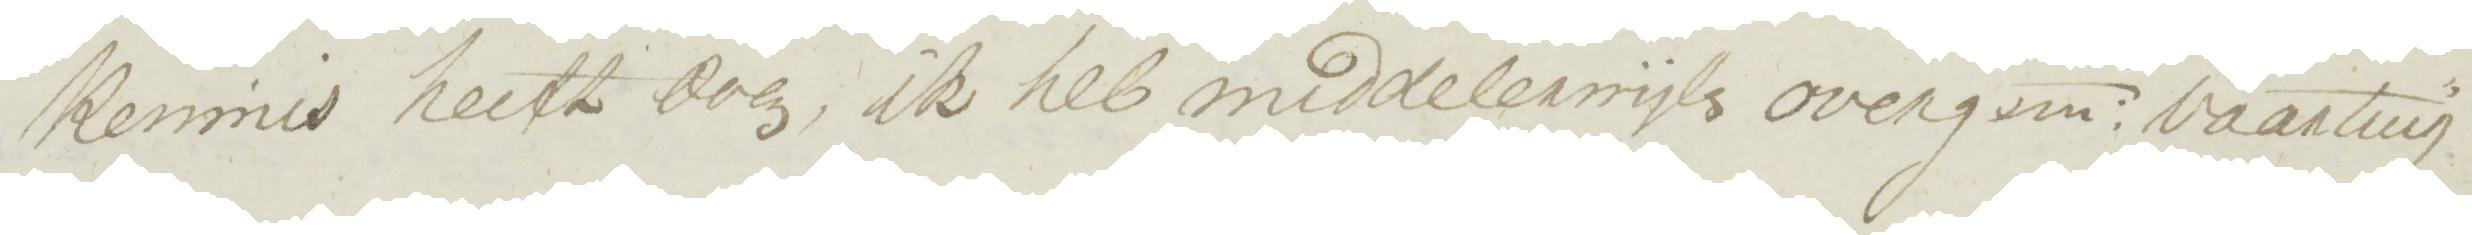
Kennis heeft doen, ik heb middelerwijlen overgem: vaartuig
